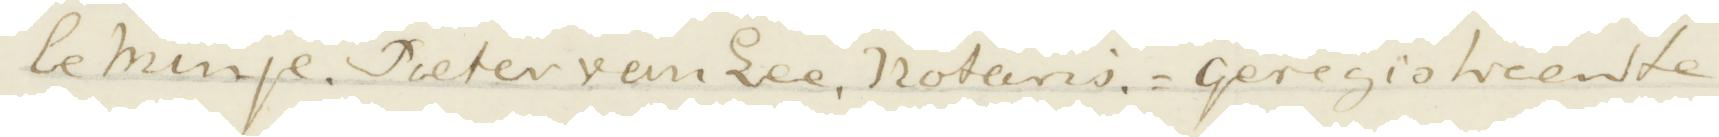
le Minje, Pieter van Lee, Notaris. = geregistreerd te
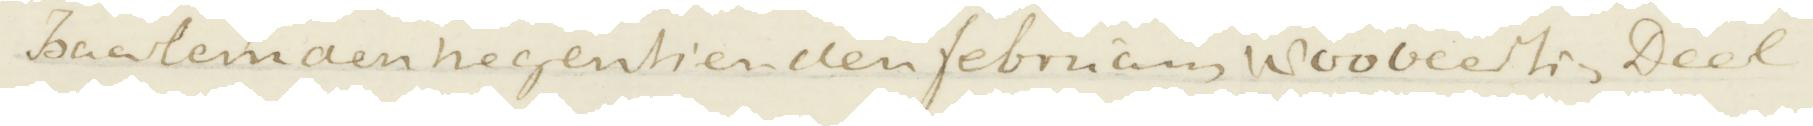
haarlem den negentienden february 1800 veertig Deel
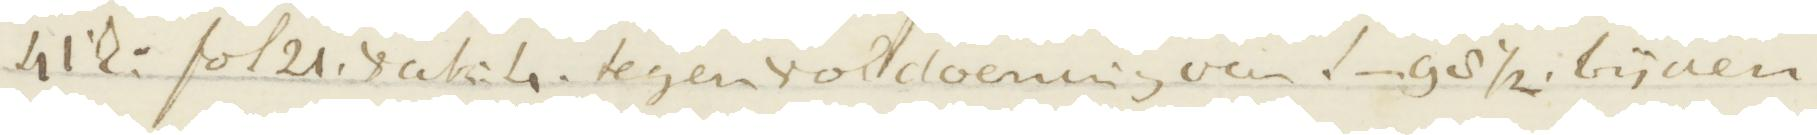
41 V.' fol 21. Vak 4. tegen voldoening van ƒ- 98½: bij den
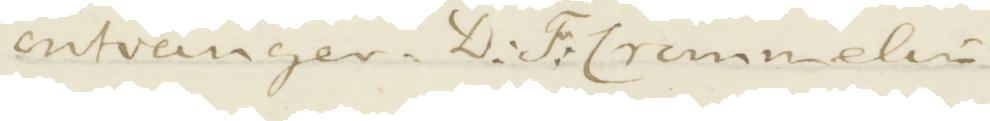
ontvanger. D: F: Crommelin=
